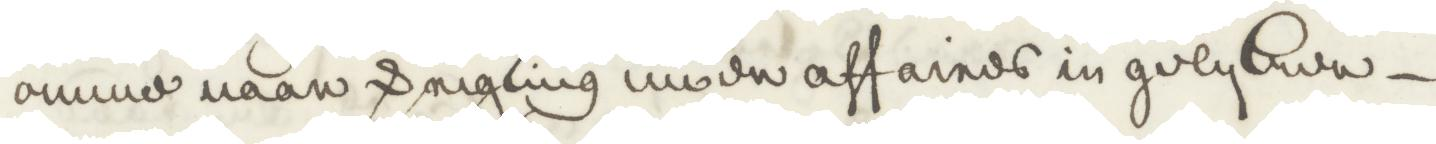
omme naar verrigting uwer affaires in gelijker —
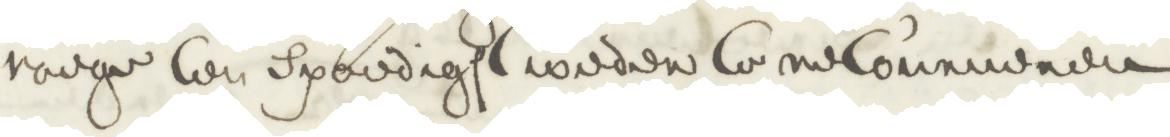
voege ten spoedigst weder te retourneren
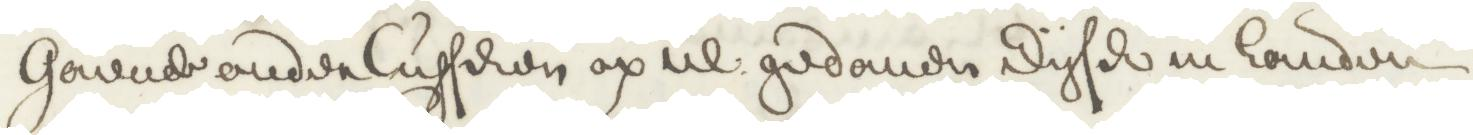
Gaende ondertusschen op ul: gedanen Eijsch in handen
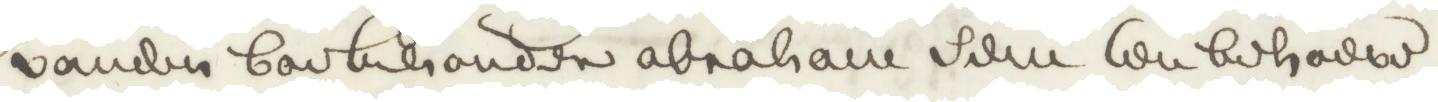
vanden boekhouder abraham sem ten behoeve
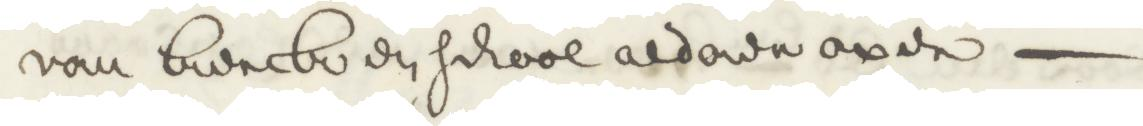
van kerck en school aldaer over —
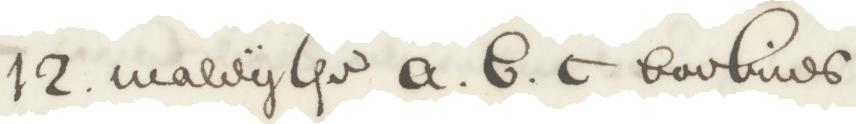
12. maleijtse a. b. c boekies
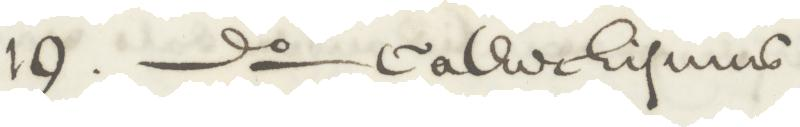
19. d=o cathechismus
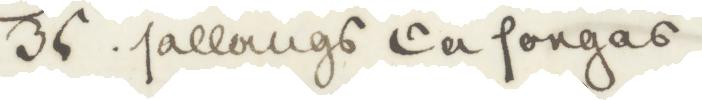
35. jallangs ca sorgas
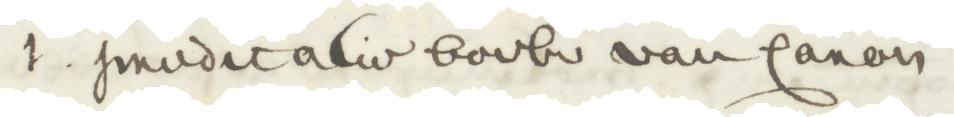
1. predicatie boek van Caron
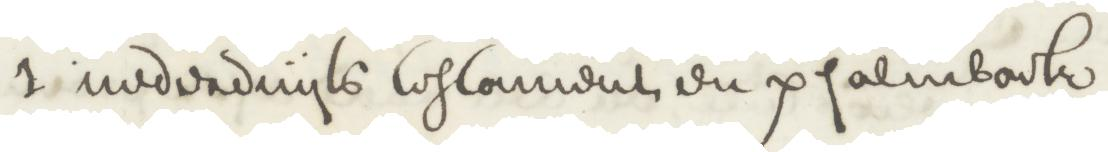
1 nederduijts testament en psalmboek
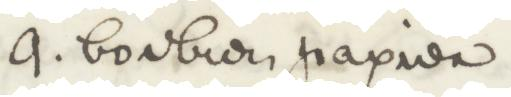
4. boeken papier
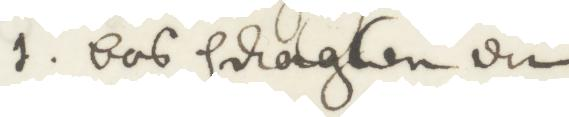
1. bos schagten en
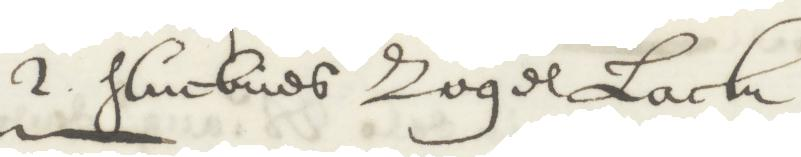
2. stuckies zegel Lack
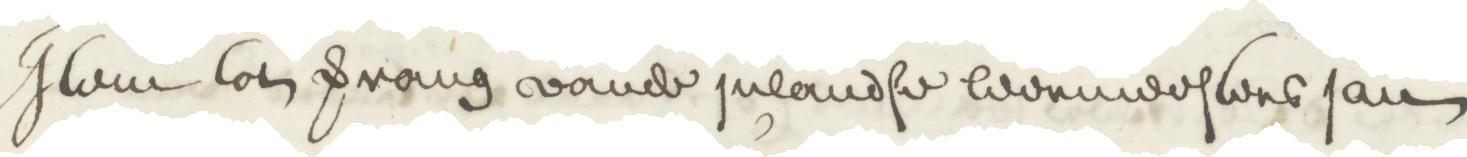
Item tot vervang vande inlandse leermeesters Jan
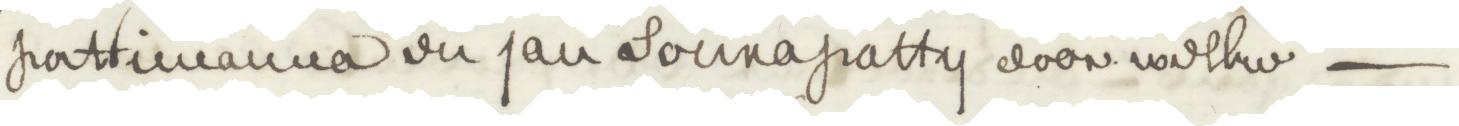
pattienanna en Jan Sourapatty door welke —
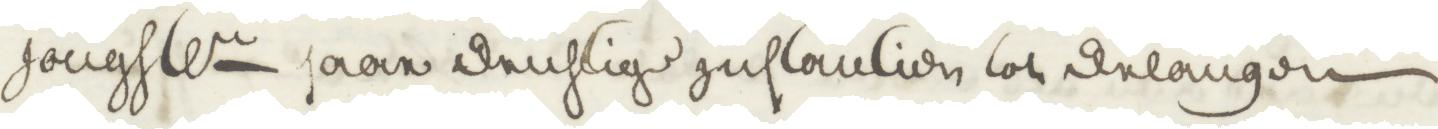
jongstl= jaar ernstige jnstantien tot Erlangen
